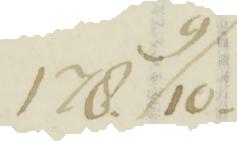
178 9/10
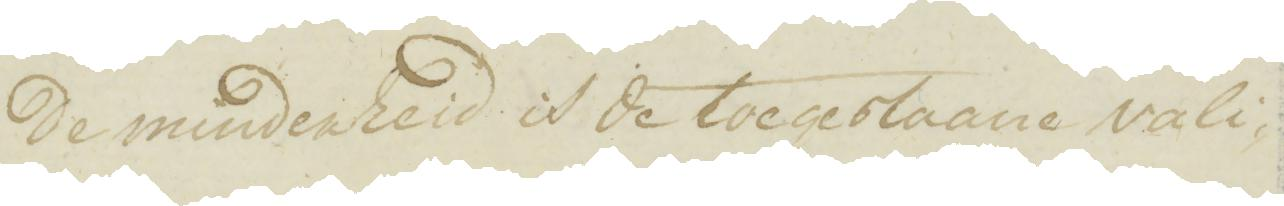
de minderheid is de toegestaane vali„
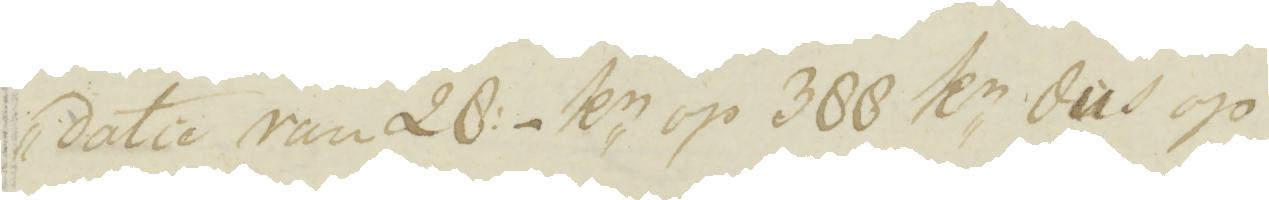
„datie van 28:- k„n op 388 k„n dus op
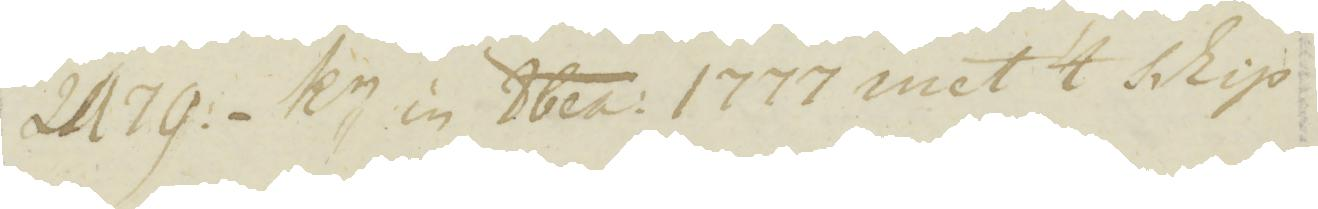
2479:-k„n in 8ber: 1777 met ’t schip
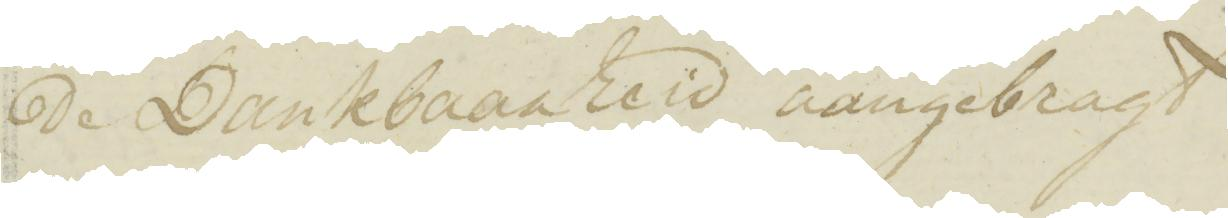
de Dankbaarheid aangebragt
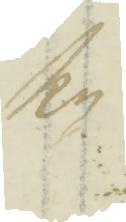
kn
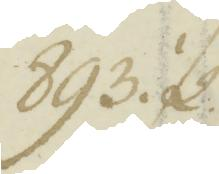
893. ½
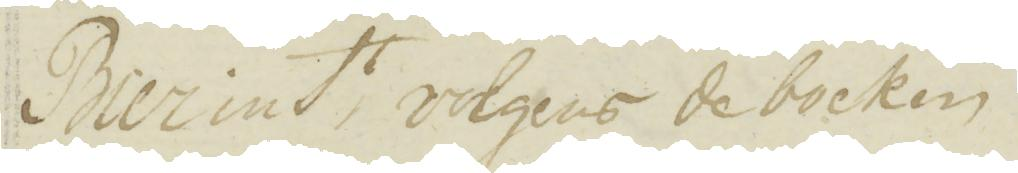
Bier ins„t volgens de boeken
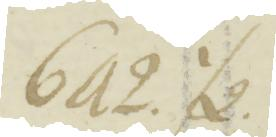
642. ½
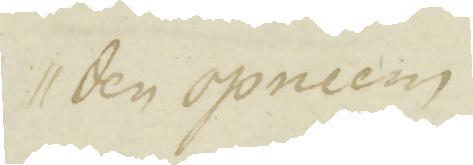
„den opneem
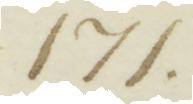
171.
